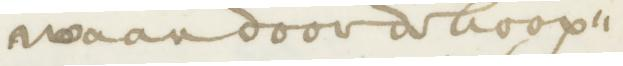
waar door de koop„
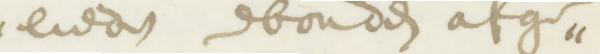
lieden worden afge„
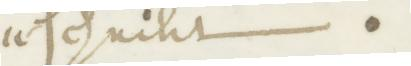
schrikt.
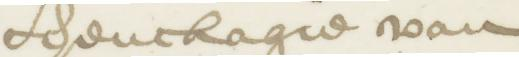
Schenckagie van
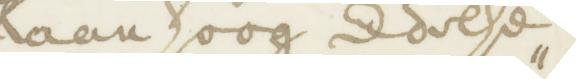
haar hoog Edelhe„
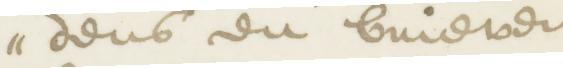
„dens en brieven
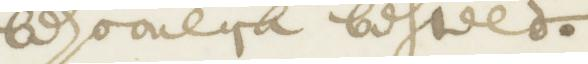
behoorlijk besteld.
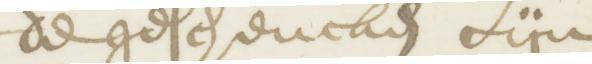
de geschencken sijn
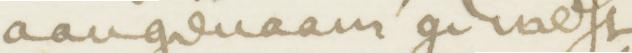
aangenaam geweest,
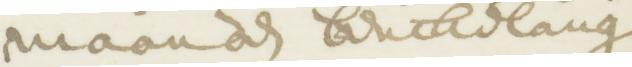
maar den berckelang
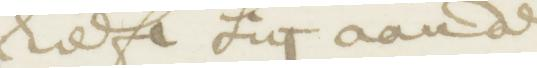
heeft sig aan de
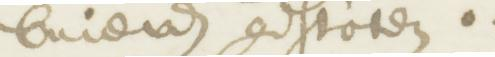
brieven gestóten.
